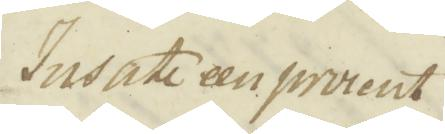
Insate een procent
